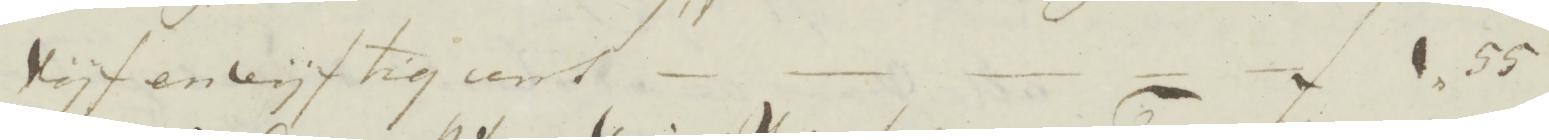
Vijf en vijftig cent — — — — —ƒ 1„55
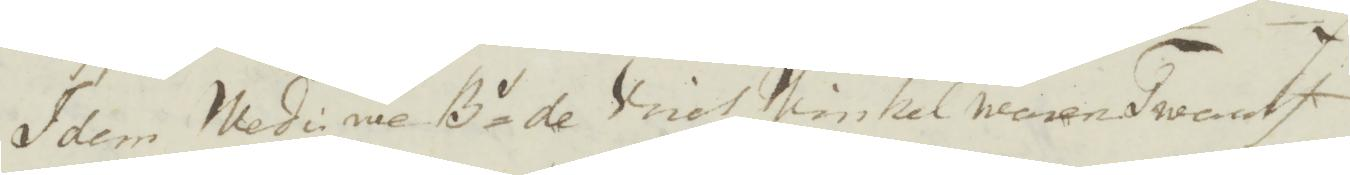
Idem Weduwe B=s de Vries Winkel waren Twaalf
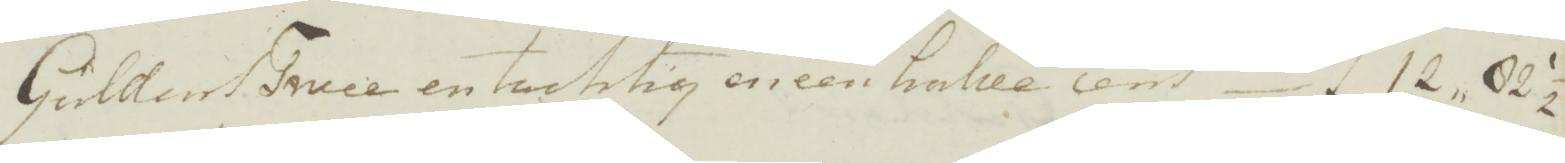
Guldens Twee en tachtig en een halve cent — ƒ 12„82 ½
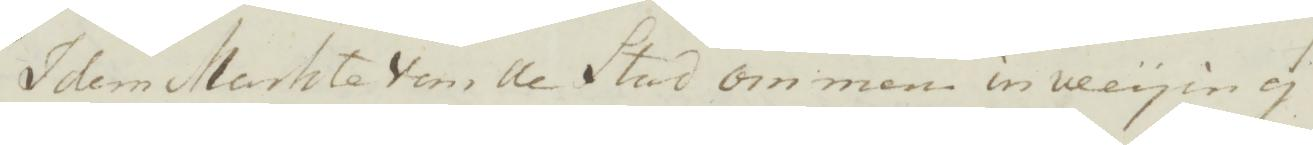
Idem Markte van de Stad ommen in weijing
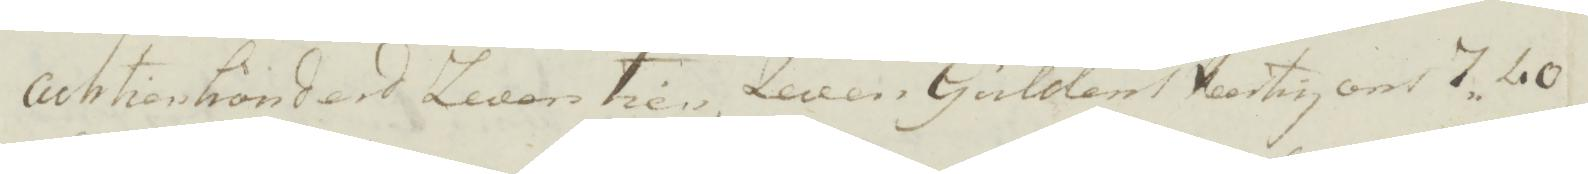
achtienhonderd Zeventien, Zeven Guldens Veertig cent 7„40
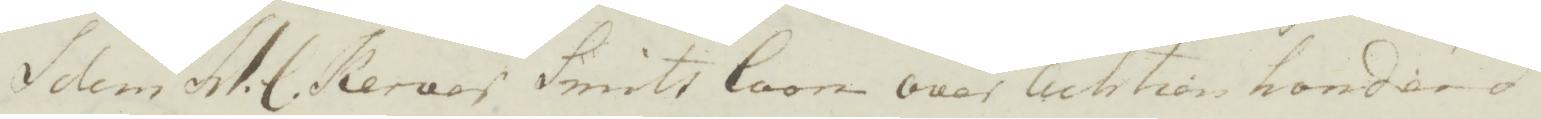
Idem M: C. Kerver Smits loon over Achtien honderd
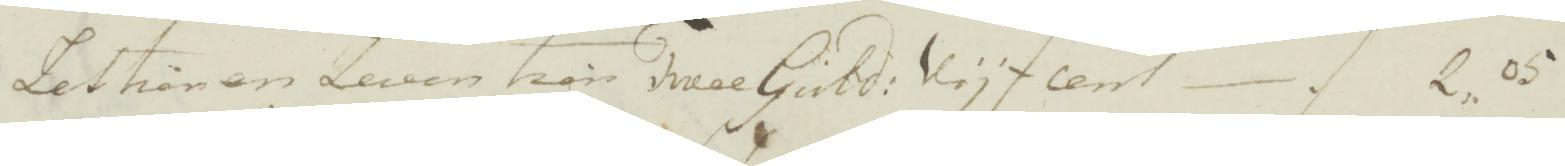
Zestien en Zeventien Twee Guld: Vijf cent — ƒ 2„05
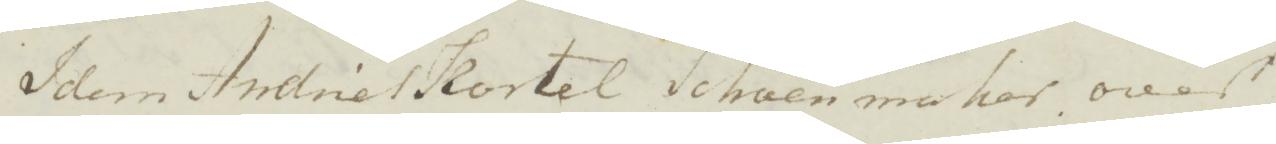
Idem Andries Kortel Schoenmaker over
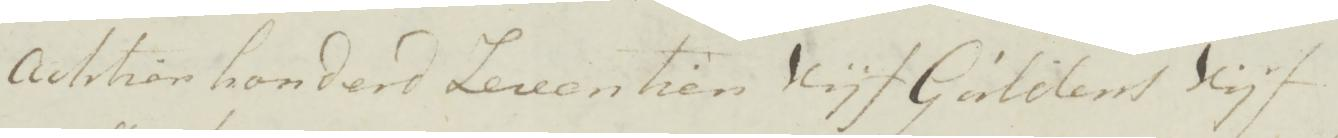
Achtien honderd Zeventien Vijf Guldens Vijf
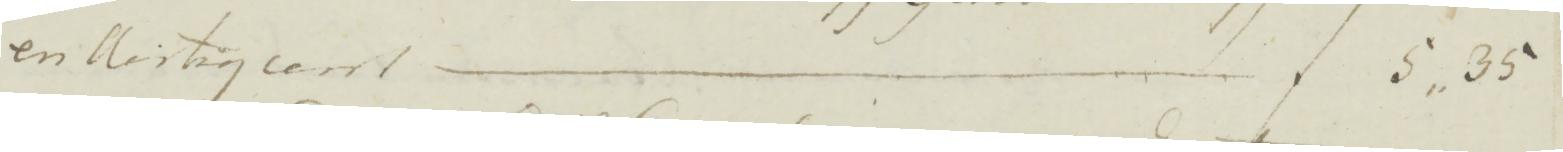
en dertig cent —ƒ 5„35
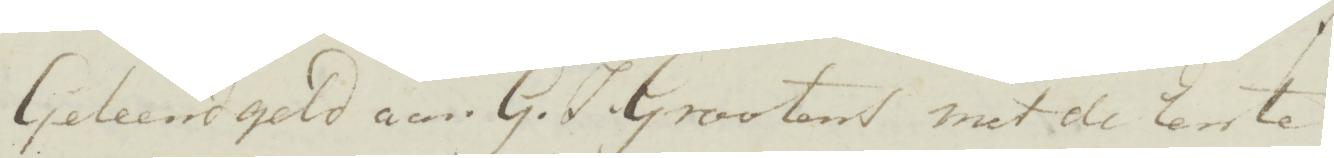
Geleend geld aan G. I: Grootens met de Eerste
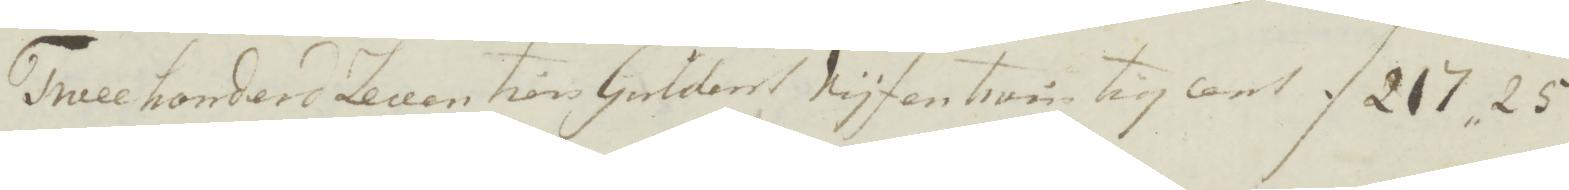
Twee honderd Zeveen tien Guldens Vijf en twintig Cent ƒ217„25
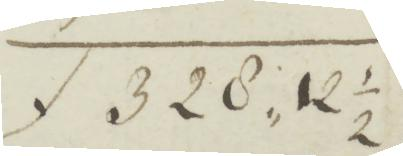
ƒ328„12 ½
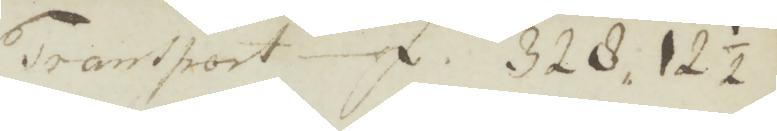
Transport ƒ. 328„12 ½
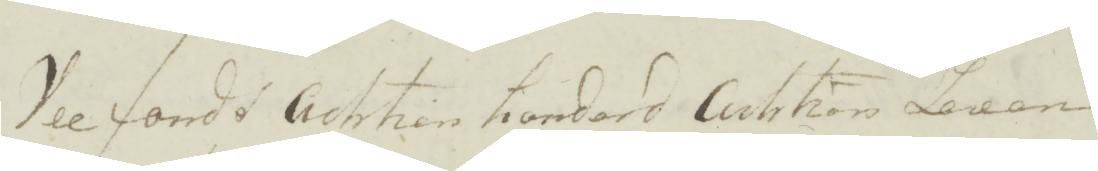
Veefonds Achtien honderd Achtien Zeven
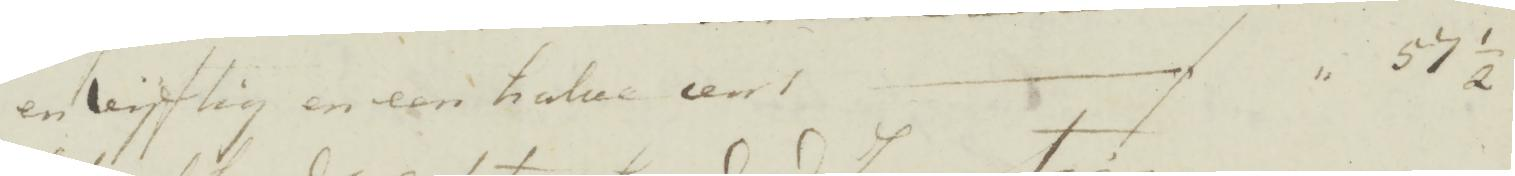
en vijftig en een halve cent —ƒ „ 57½
